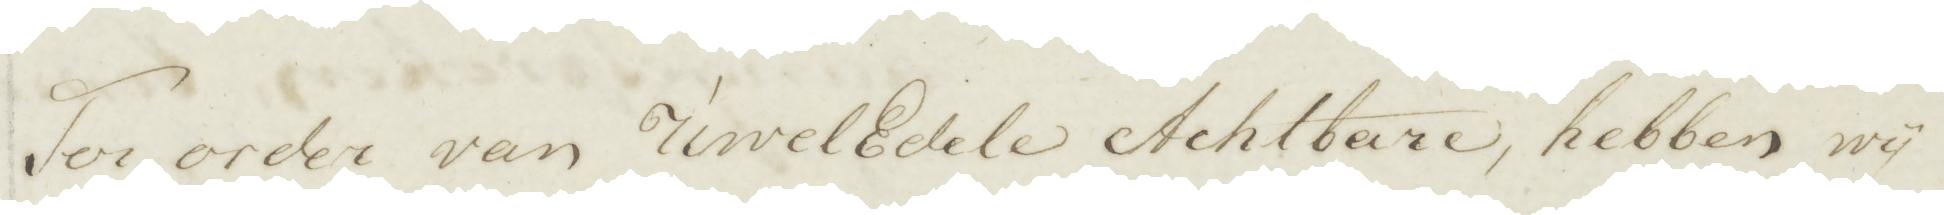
Ter order van Uwel Edele Achtbare, hebben wij
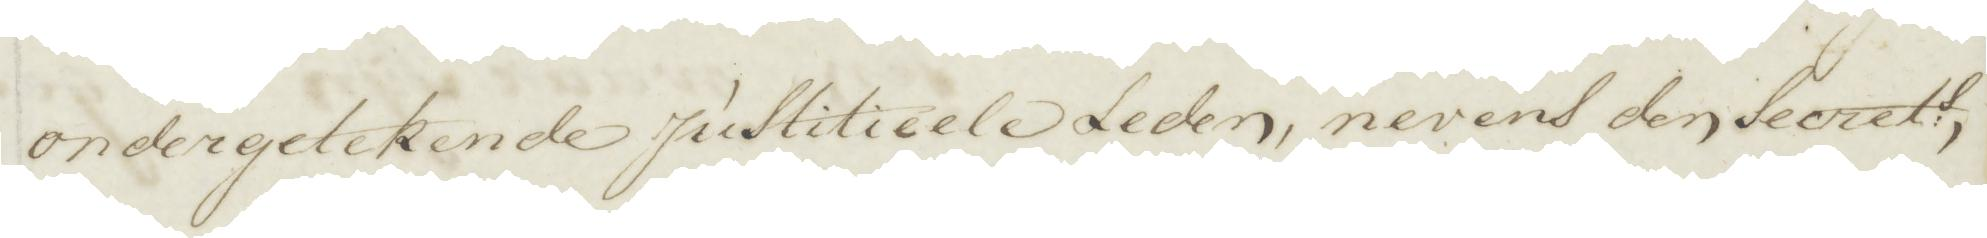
ondergetekende Justitieele Leden, nevens den secret:s,
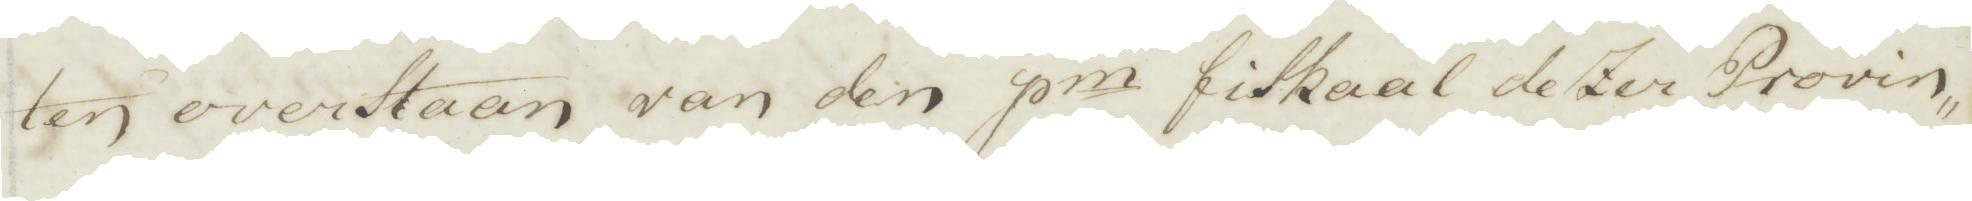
ten overstaan van den p=m fiskaal dezer Provin„
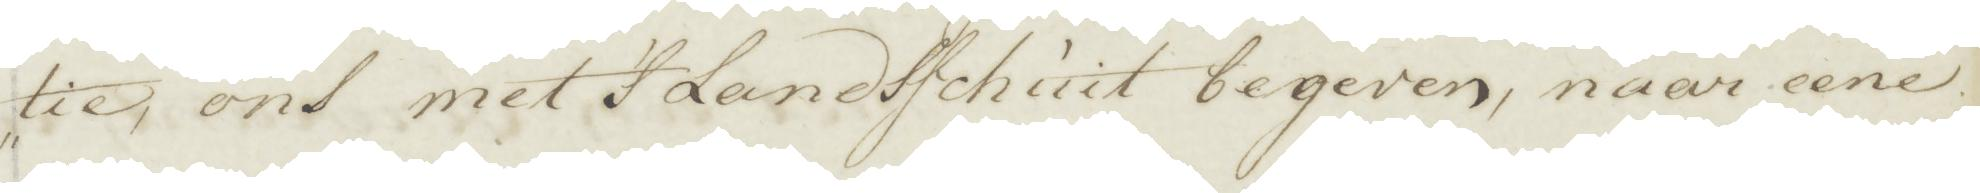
„tie, ons met 's Landsschuit begeven, naar eene
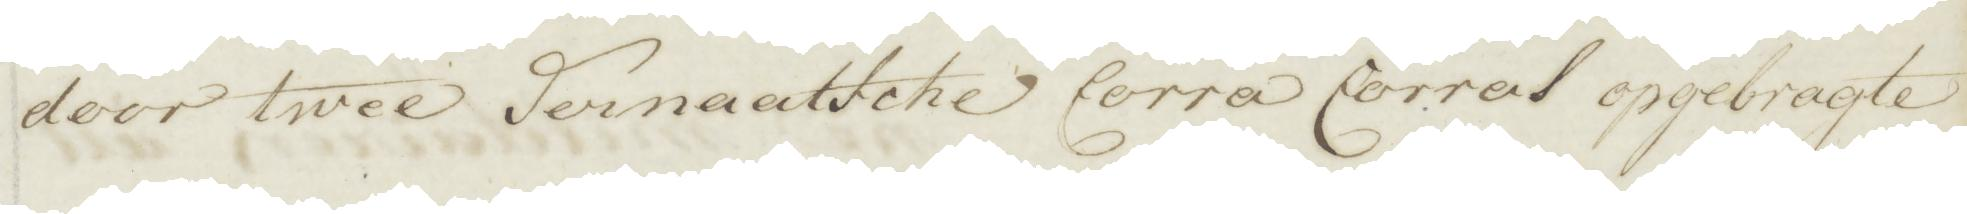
door twee Ternaatsche Corra Corras opgebragte
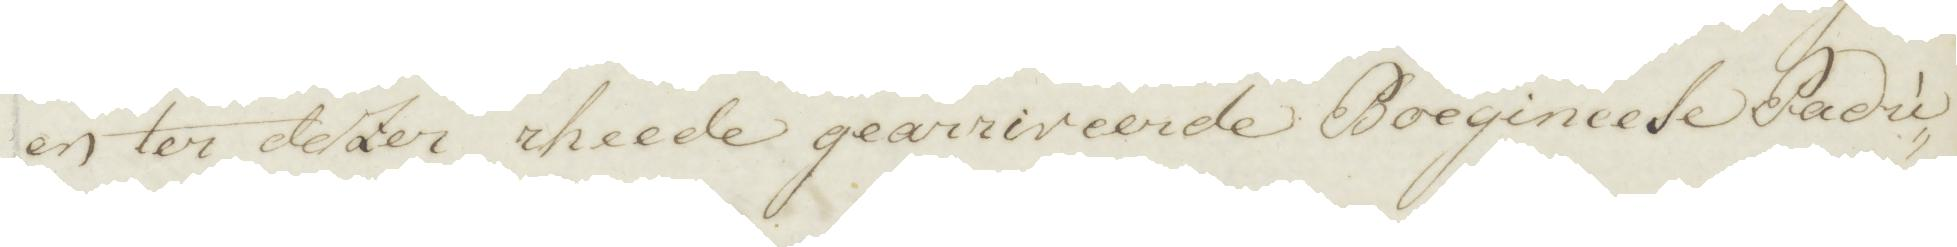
en ter dezer rheede gearriveerde Boegineese Padu„
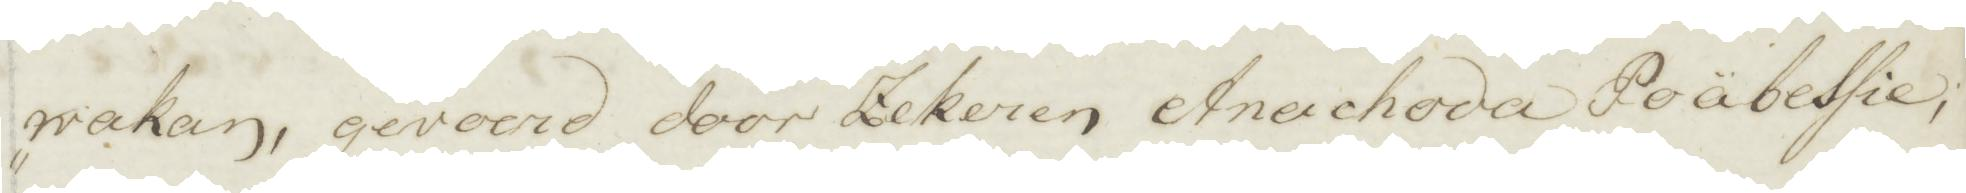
„wakan, gevoerd door zekeren Anachoda Poäbessie;
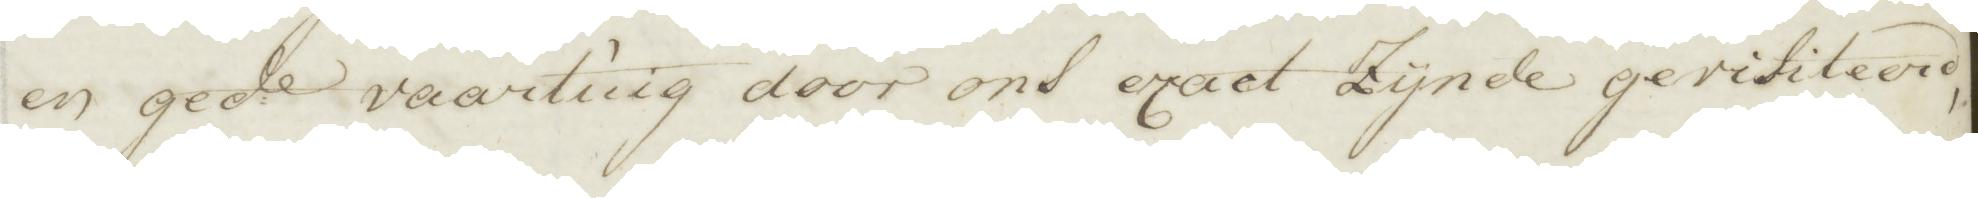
en ged:e vaartuig door ons exact zijnde gevisiteerd,
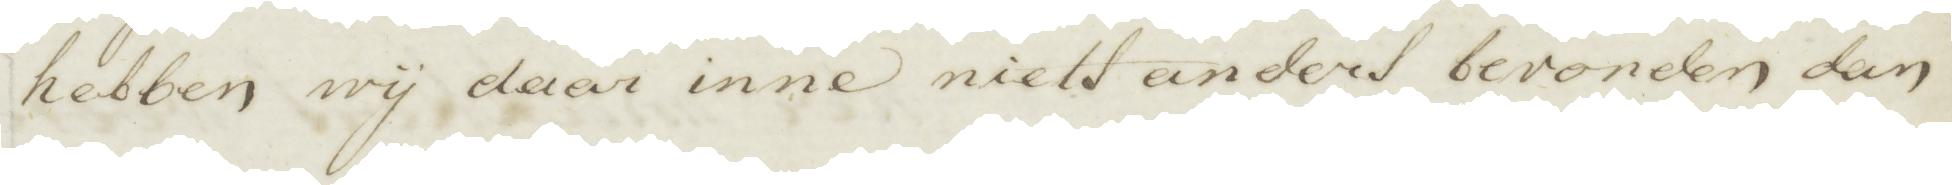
hebben wij daar inne niets anders bevonden dan
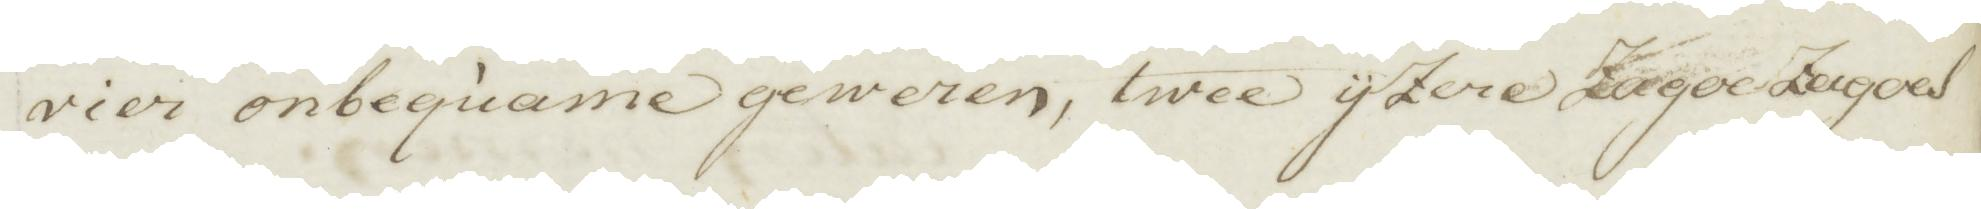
vier onbequame geweren, twee ijzere Zagoe Zagoes
